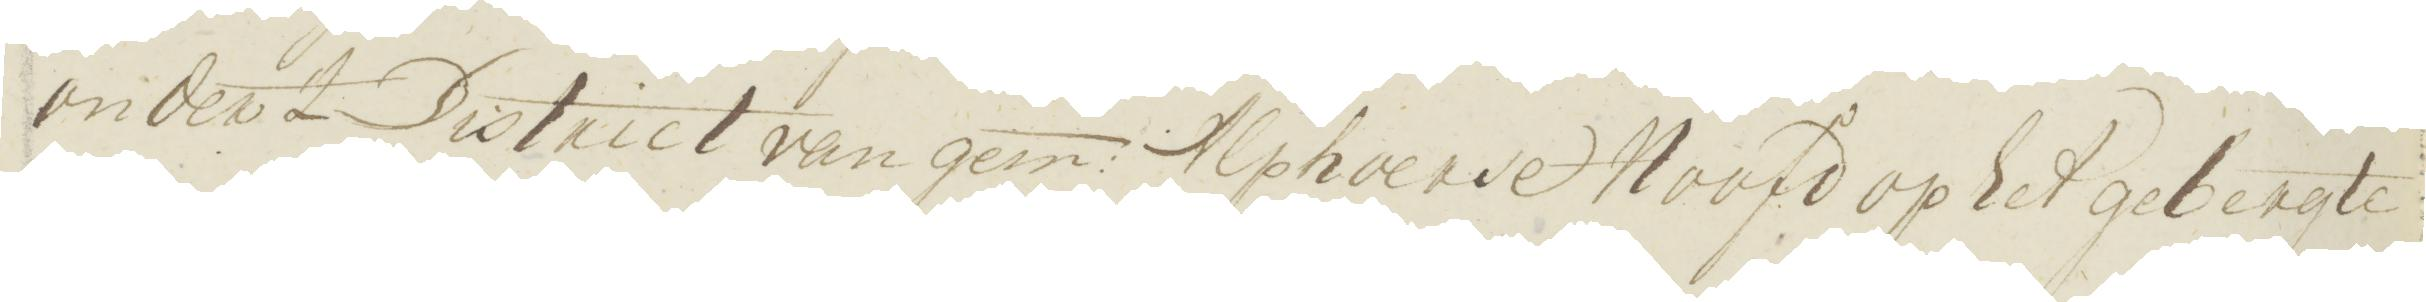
onder ’t District van gem: Alphoerse Hoofd op het gebergte
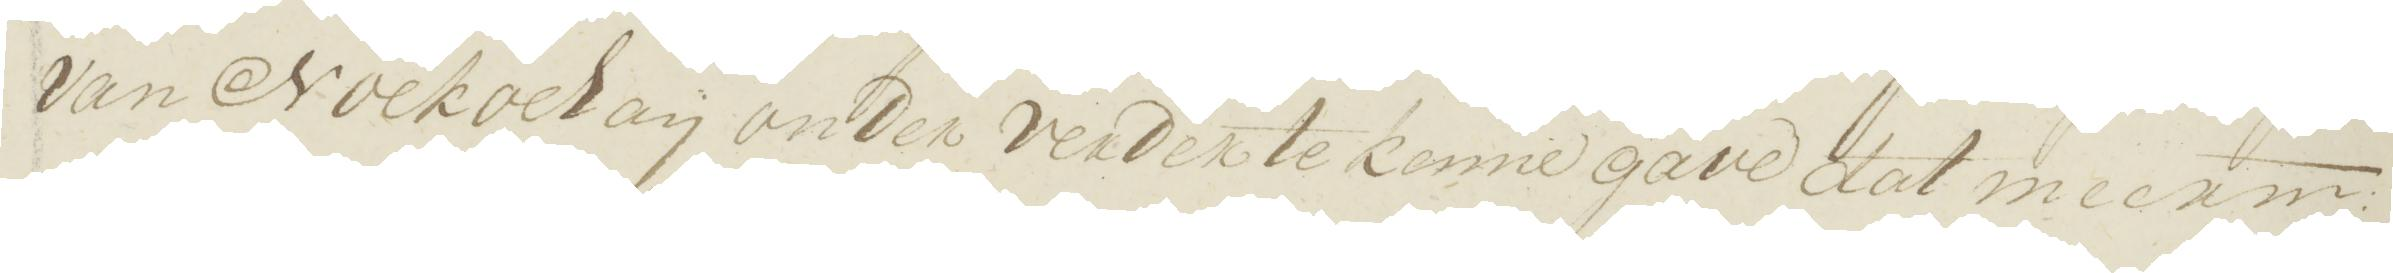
van Noekoehaij onder verder te kenne gave dat meerm:
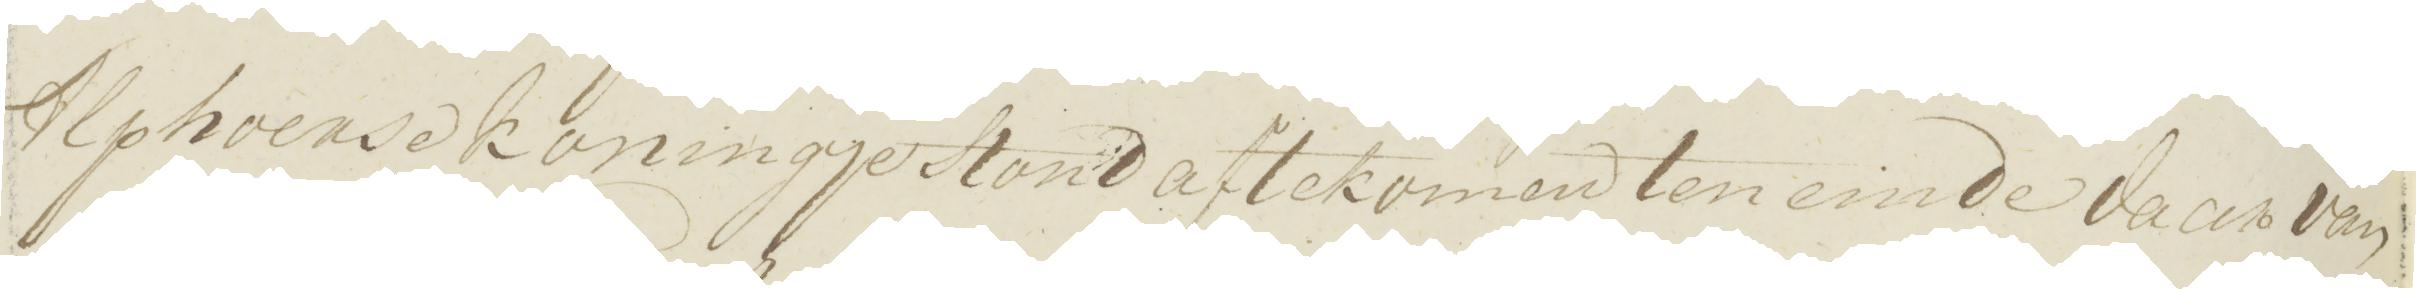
Alphoerse Koningje stond aftekomen ten einde daar van
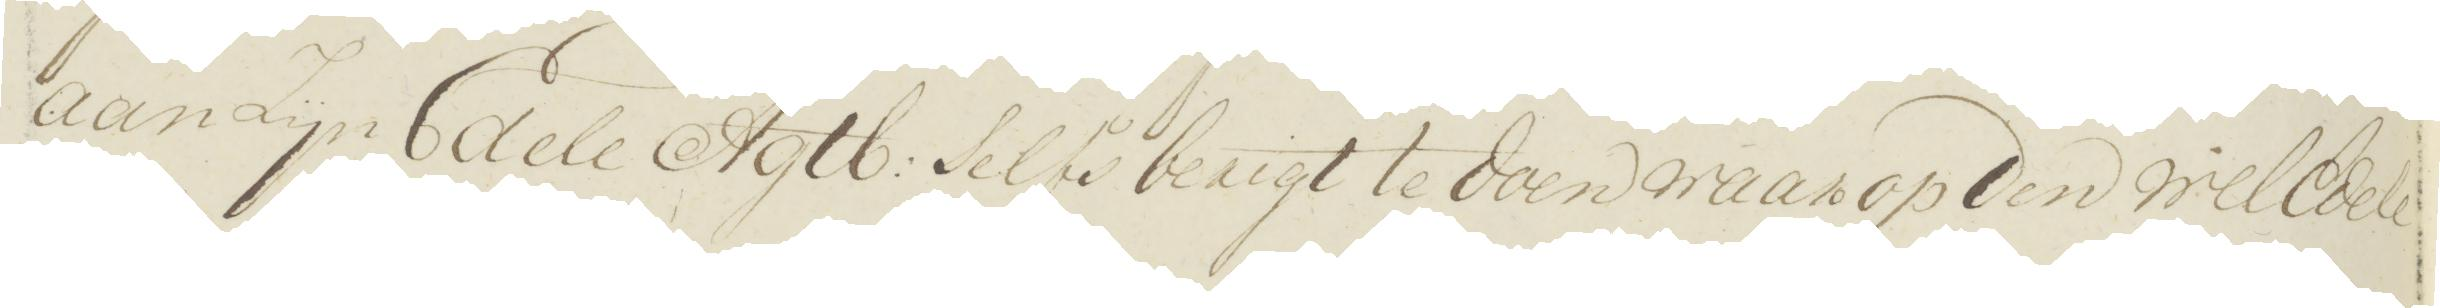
aan zijn Edele Agtb: selfs berigt te doen waar op den wel Edele
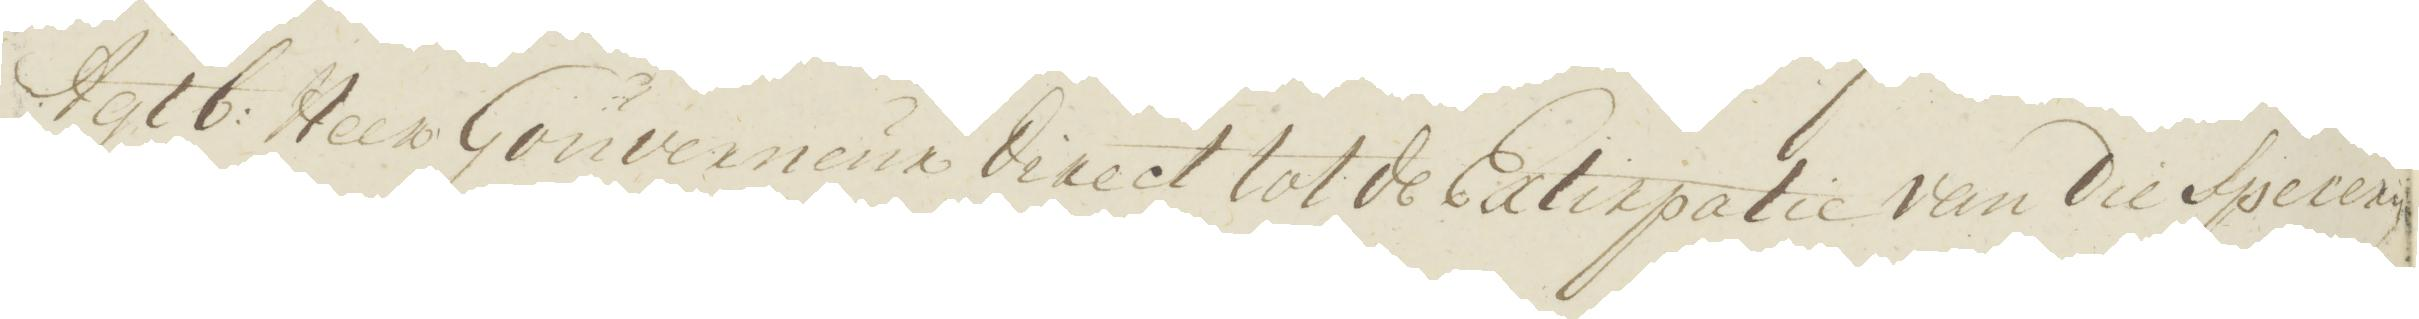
Agtb: Heer Gouverneur direct tot de Extirpatie van die specerij
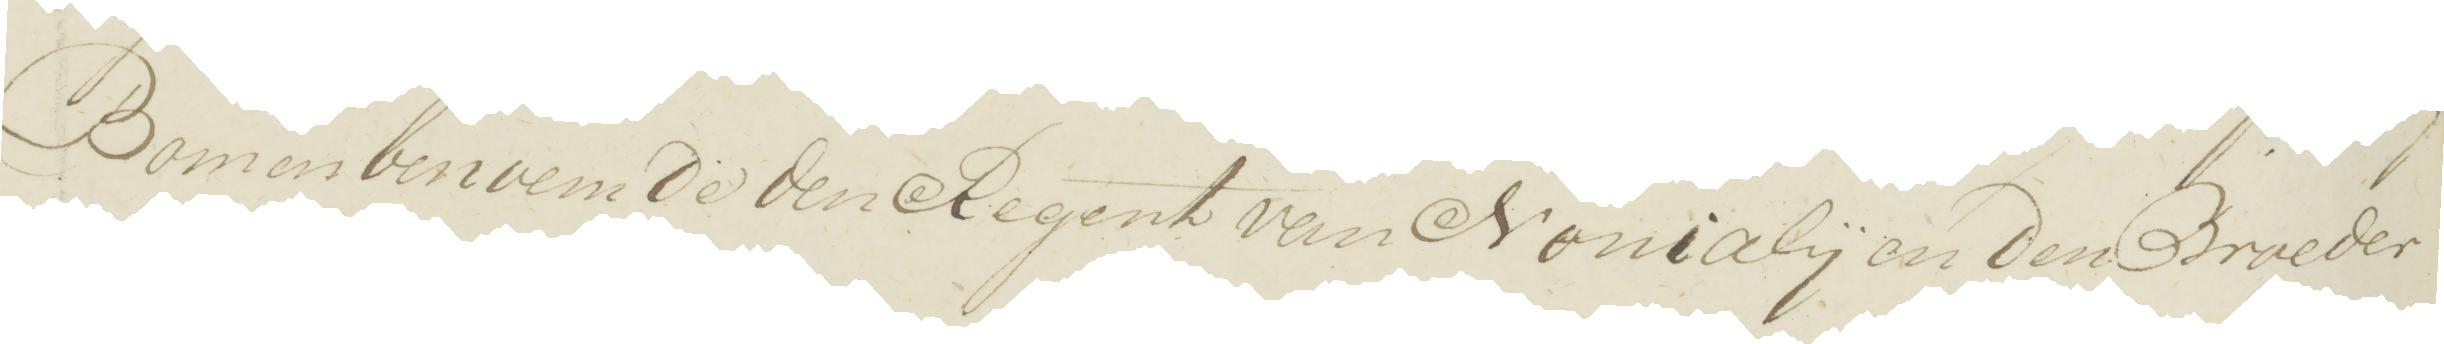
Bomen benoemde den Regent van Nonialij en den Broeder
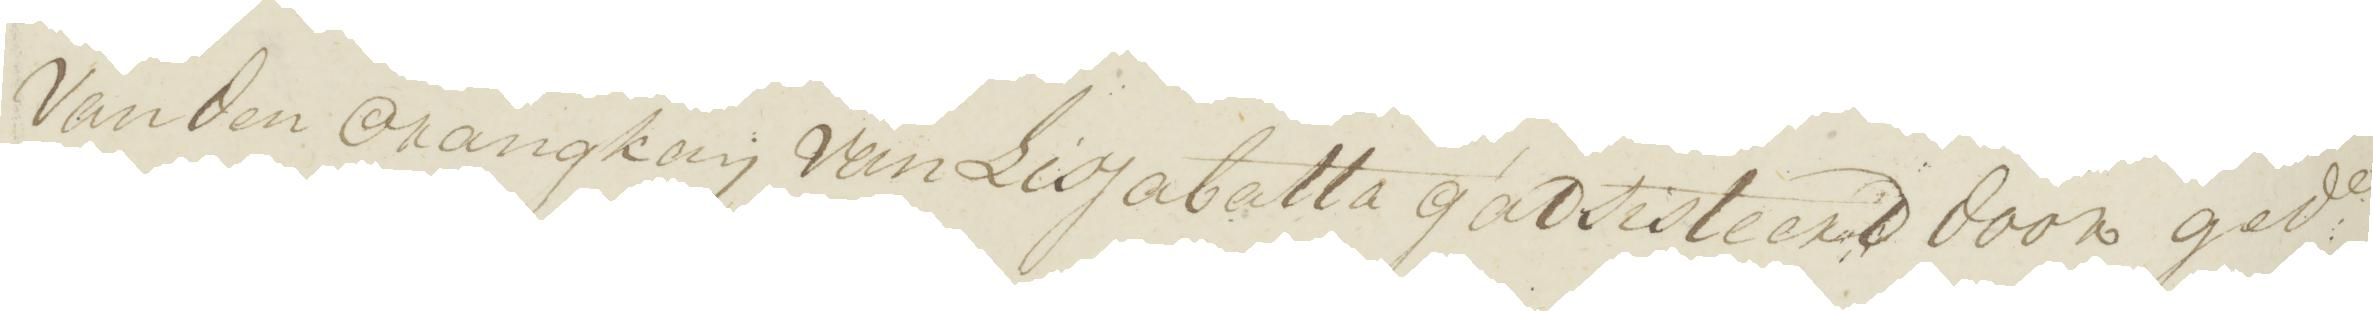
van den Orangkaij van Lisjabatta g’adsisteerd door ged:e
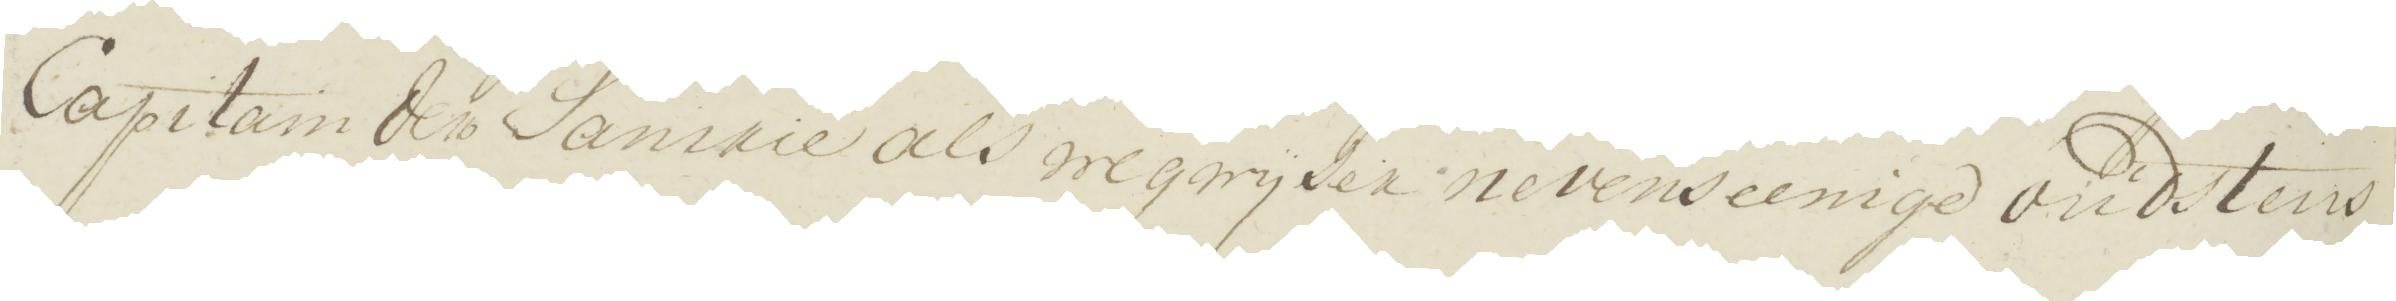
Capitain der Sanirie als wegwijser nevens eenige oudstens
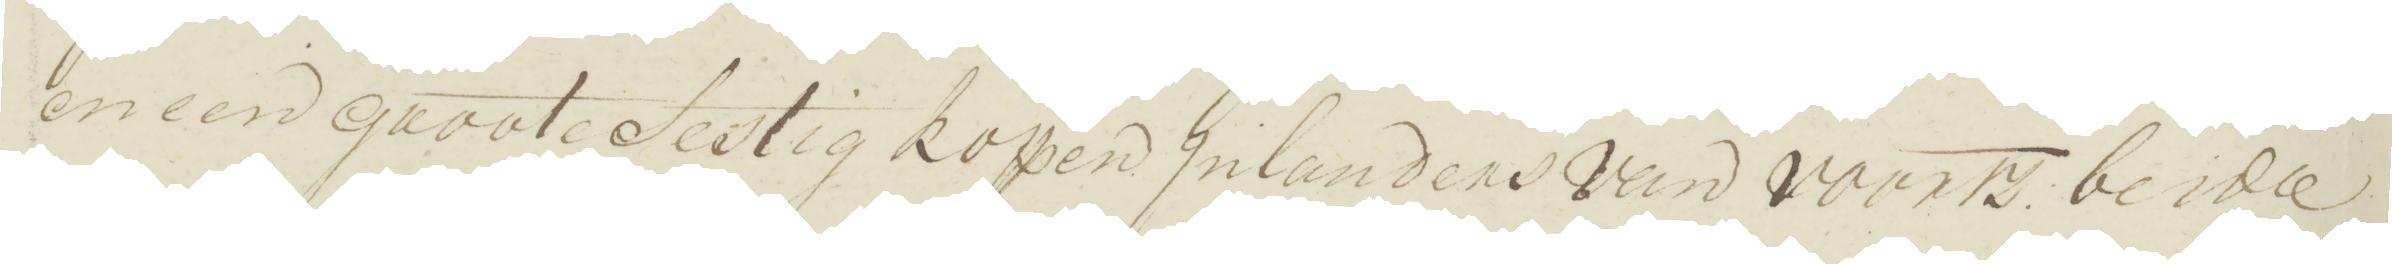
en een groote sestig koppen jnlanders van voorsz: beide
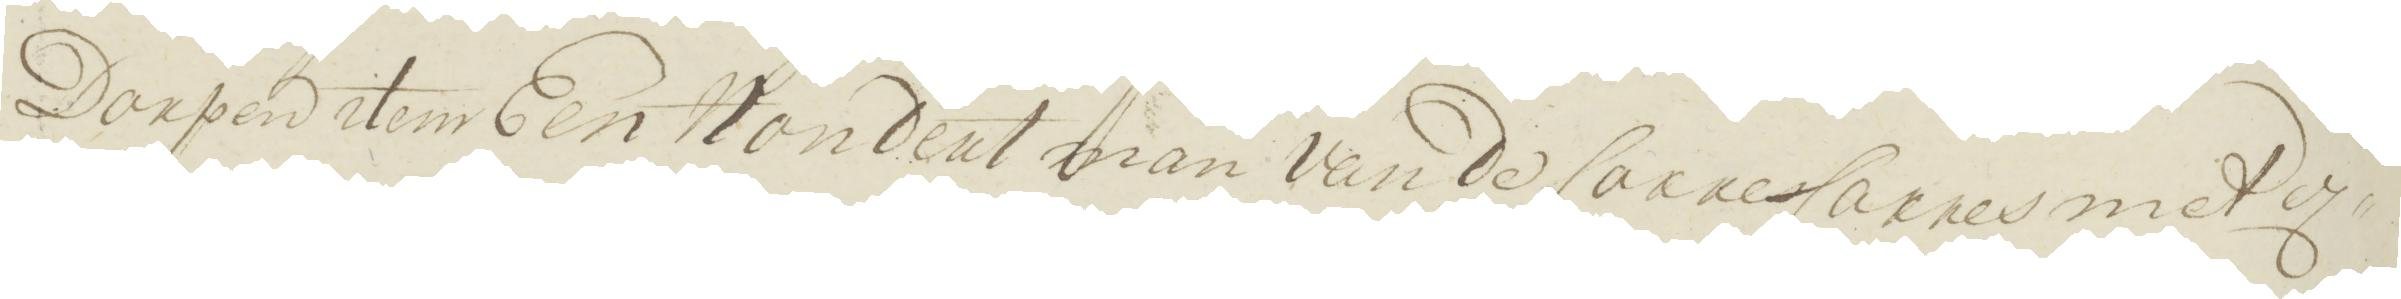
Dorpen item Een Hondert man van de Carres Carres met ex„
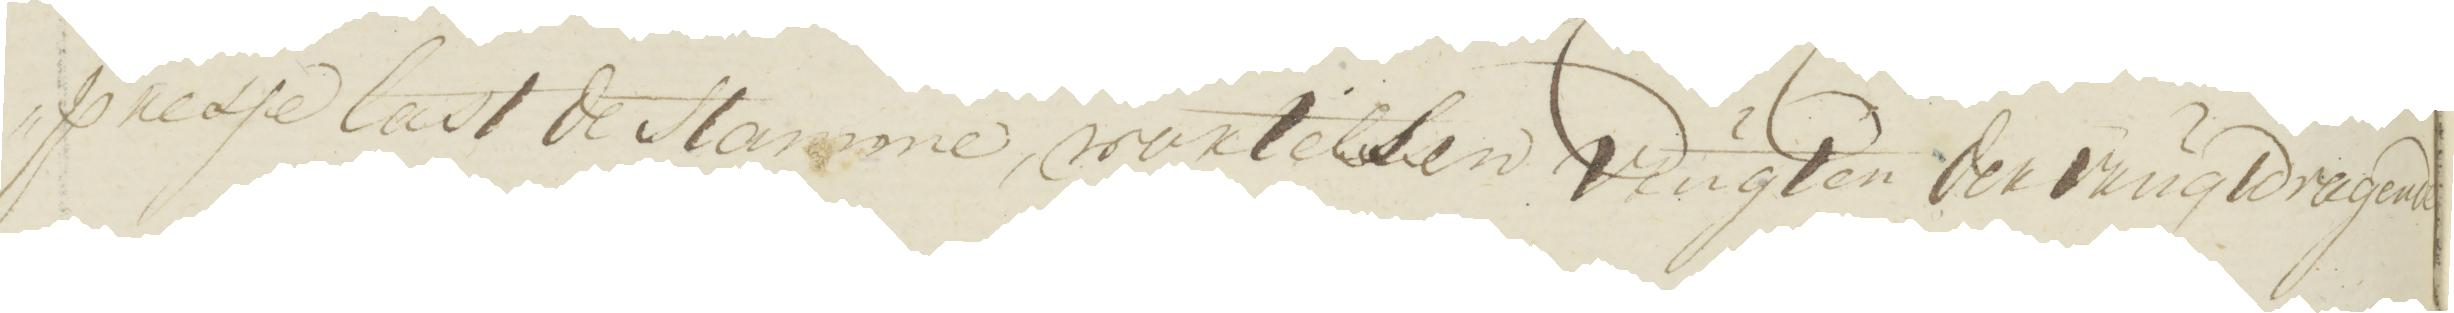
„presse last de stamme, wortels en vrugten der vrugtdragende
